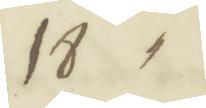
18 „
